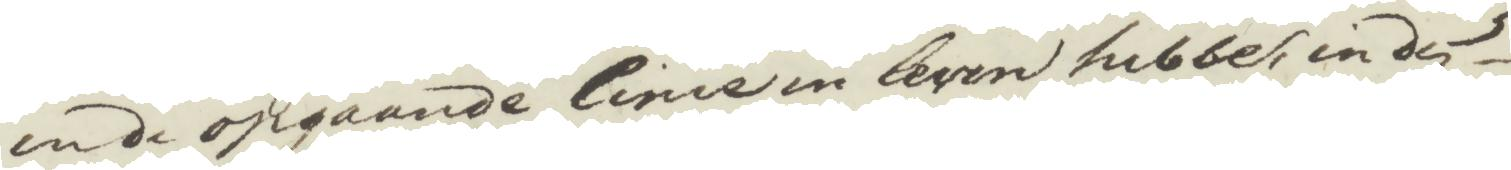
in de opgaande linie in leven hebbe, in den
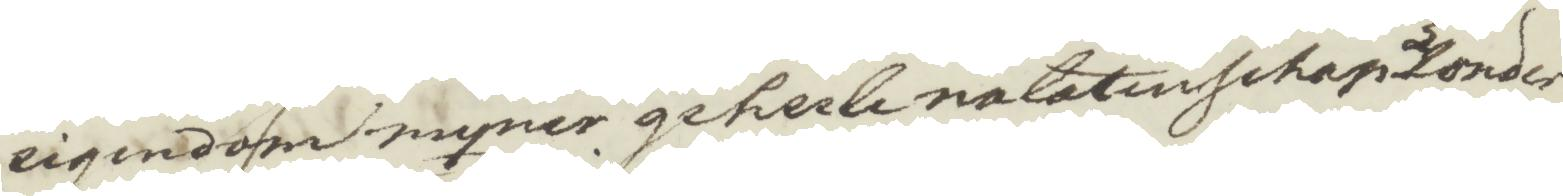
eigendom myner geheele nalatenschap zonder
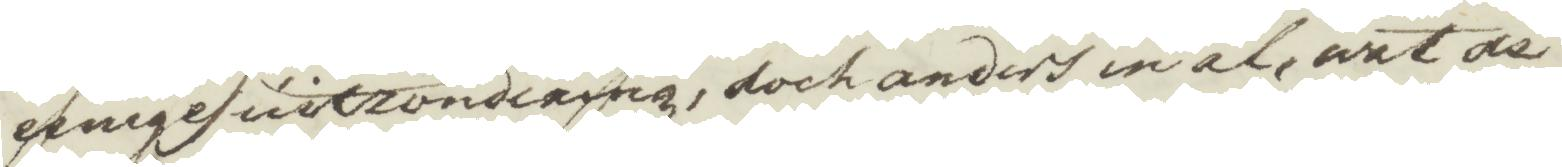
eenige uitzondering, doch anders in al, wat de
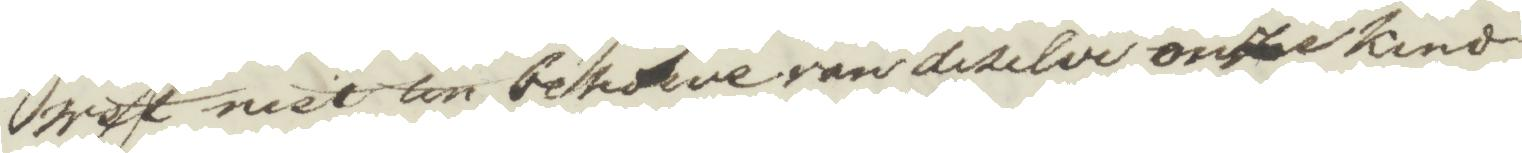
wet niet ten behoeve van dezelve onze kind
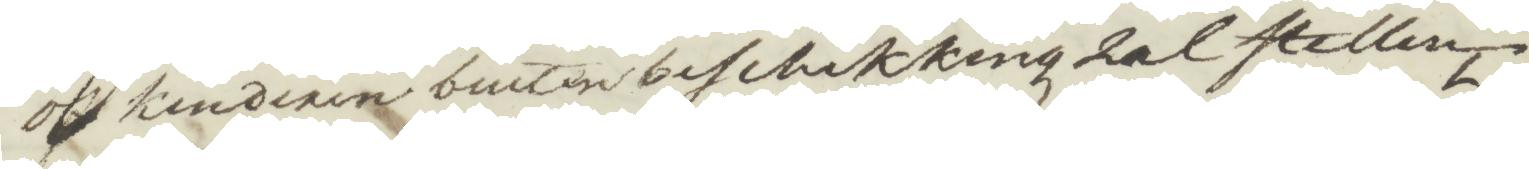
of kinderen buiten beschikking zal stellen
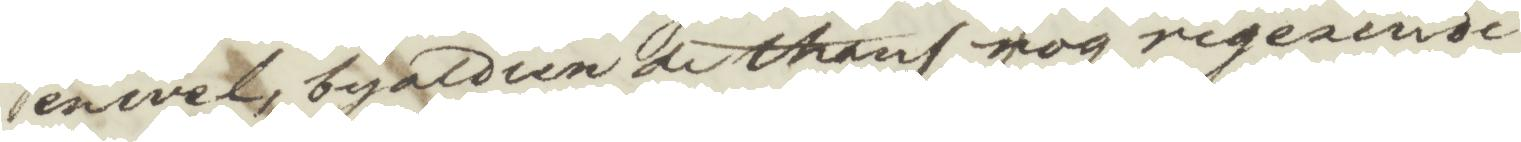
en wel, by aldien de thans nog vigerende
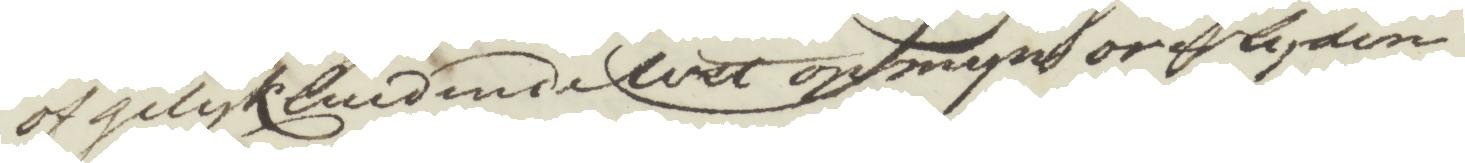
of gelykluidende wet op myn overlyden
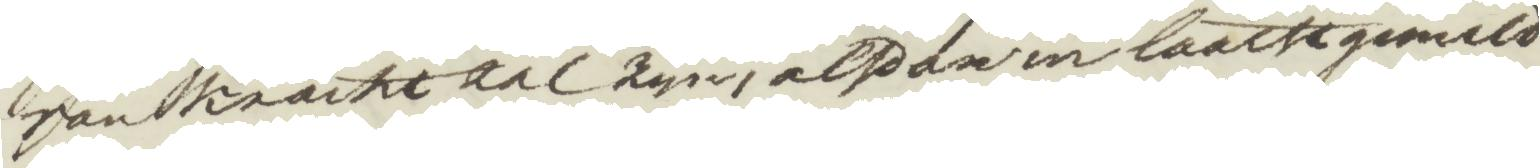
van kracht zal zyn, alsdan in laatst gemeld
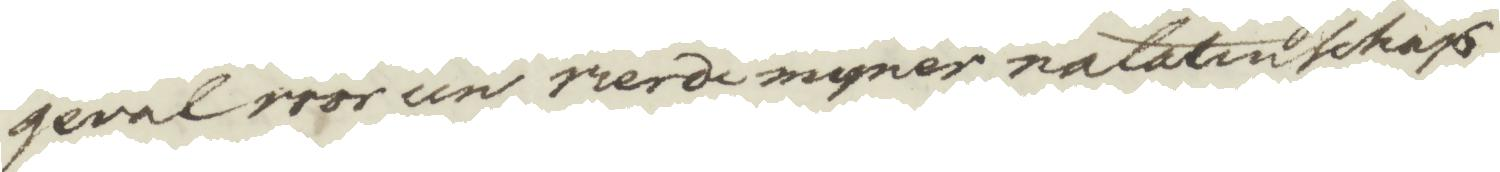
geval voor een vierde myner nalatenschap
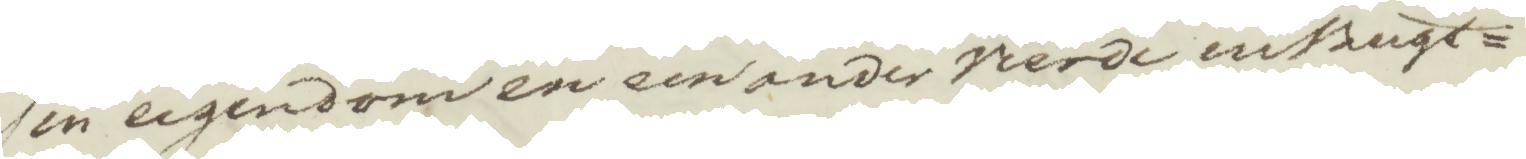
in eigendom en een ander vierde in vrugt=
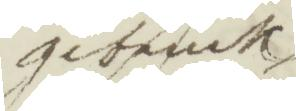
gebruik
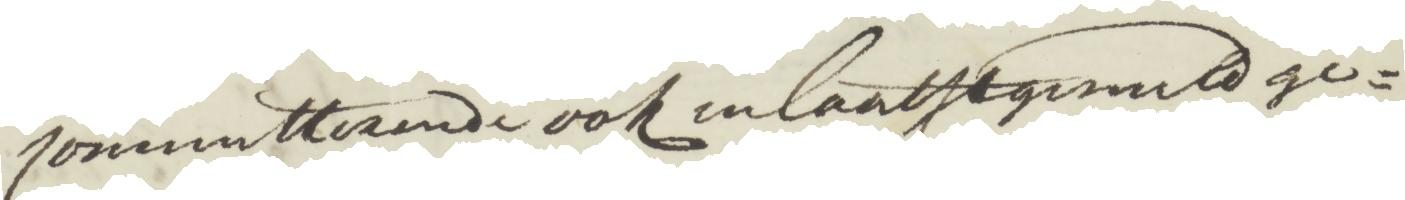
Committerende ook in laatst gemeld ge=
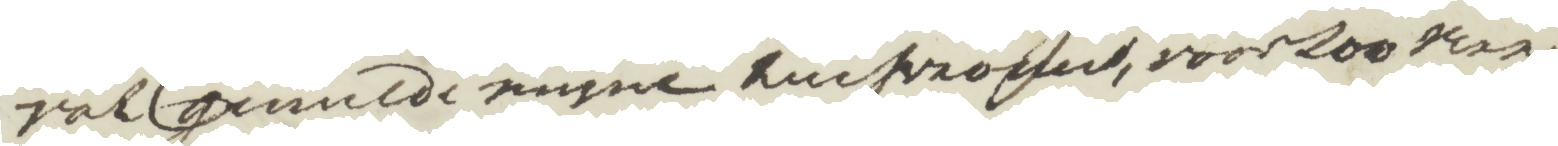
val gemelde myne huisvrouw, voor zoo verre
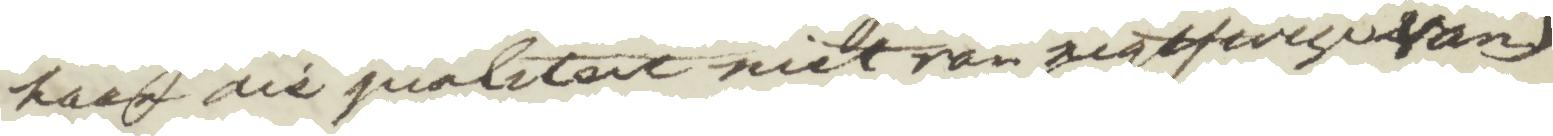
haar die qualiteit niet van regtswege van
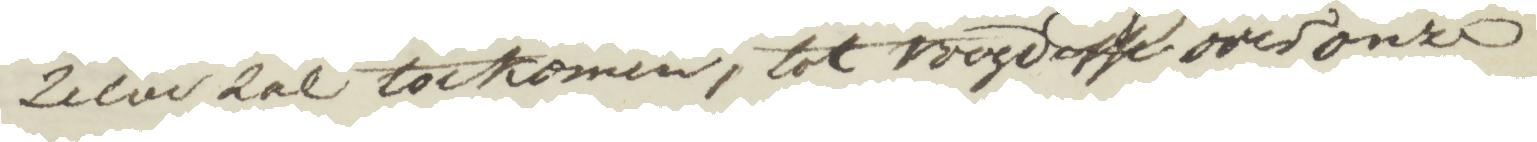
zelve zal toekomen, tot voogdesse over onze
